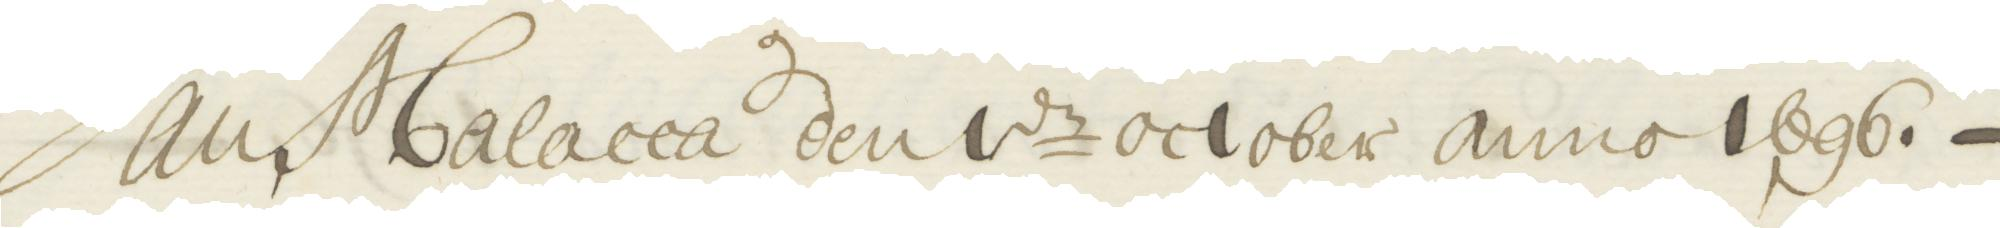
Van Malacca den 1=en october anno 1696. —
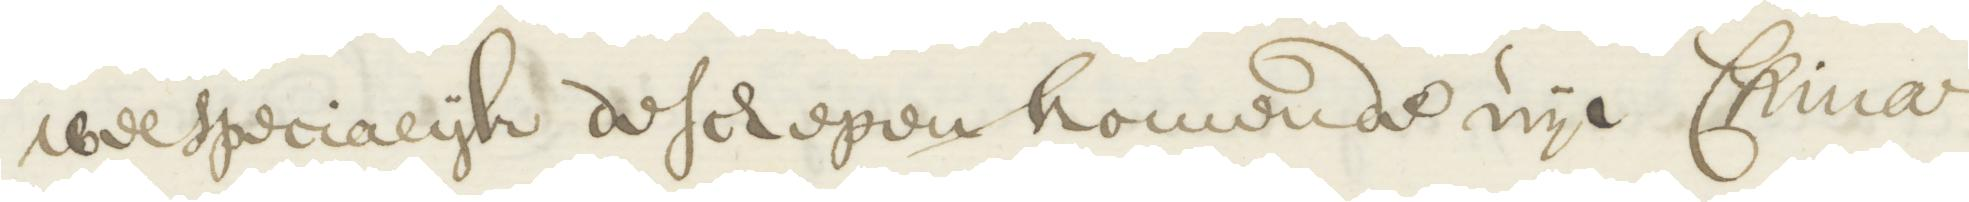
wel specialijk de schepen komende uijt China
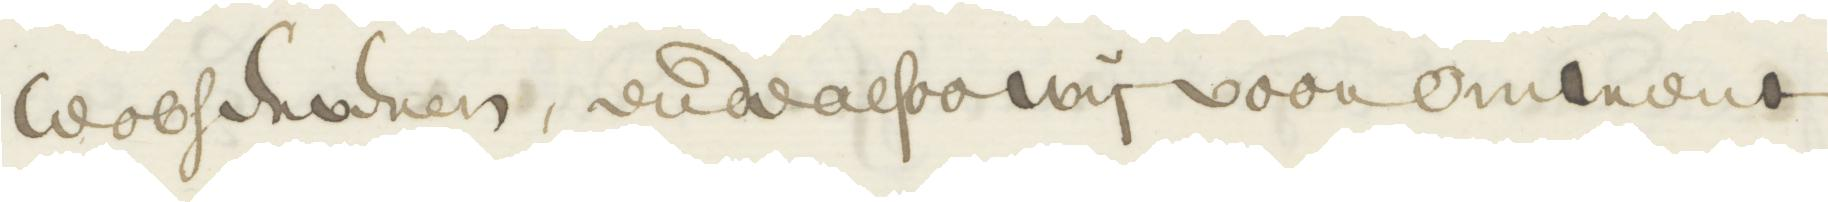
te observeren, en de alsoo wij voor omtrent
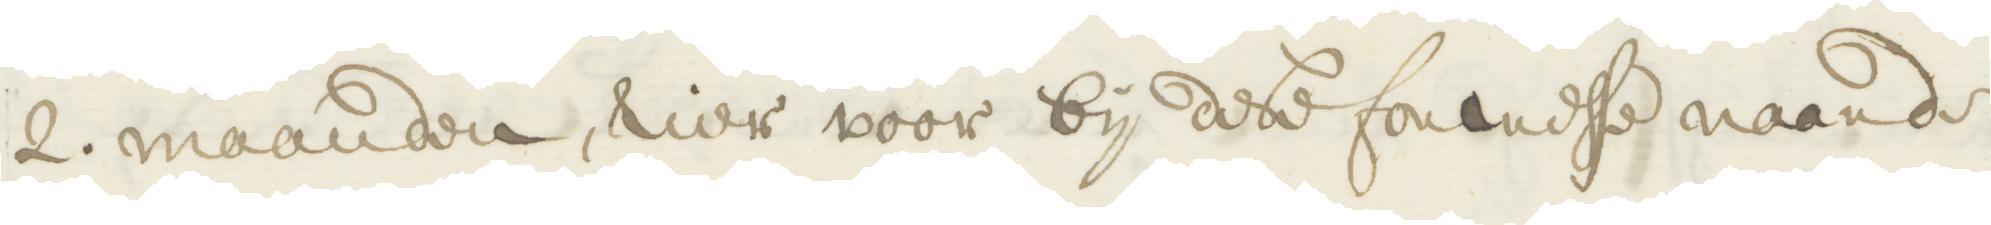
2. maanden, hier voor bij dese fortresse naar de
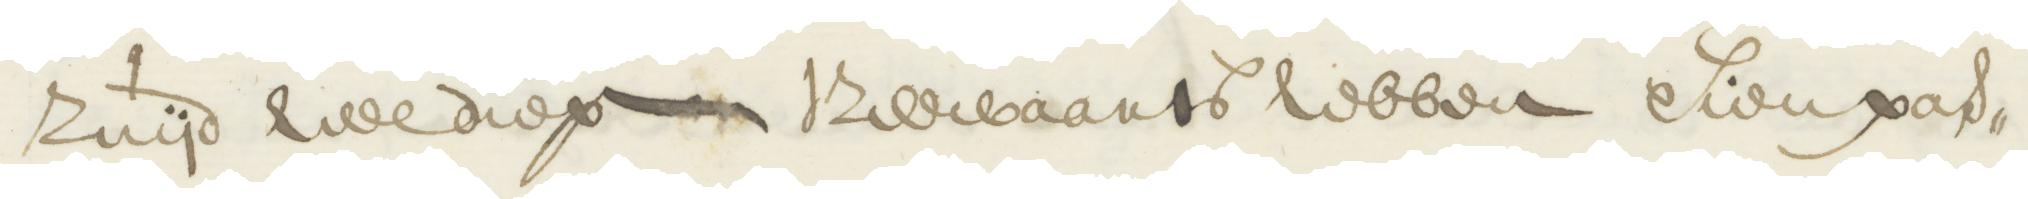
zuijd heel diep t zeewaarts hebben sien pas„
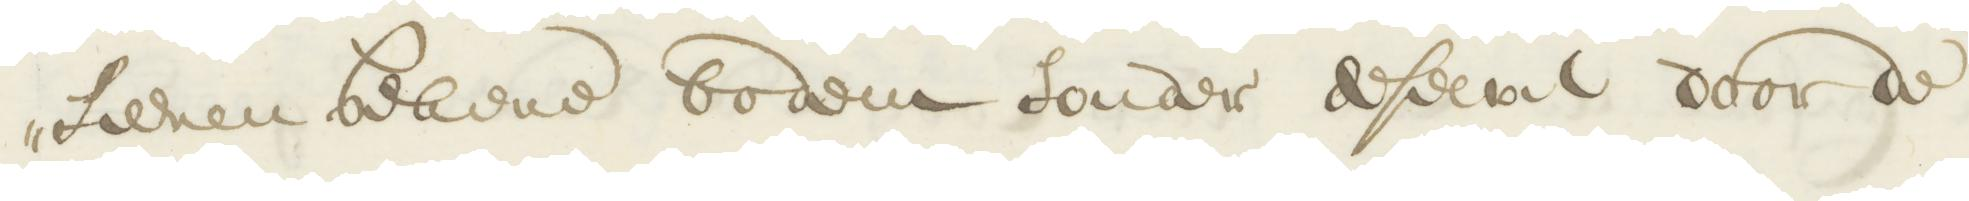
„seeren sekere bodem sonder deselve door de
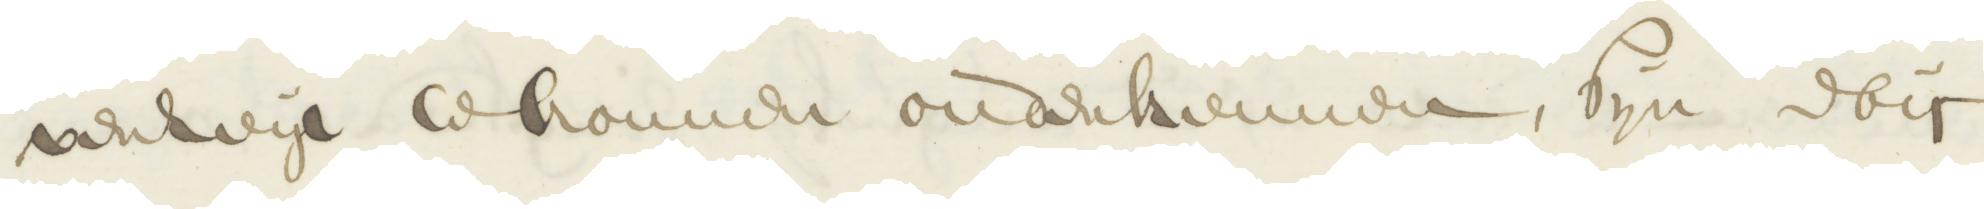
verheijt te konnen onderkennen, sijn wij
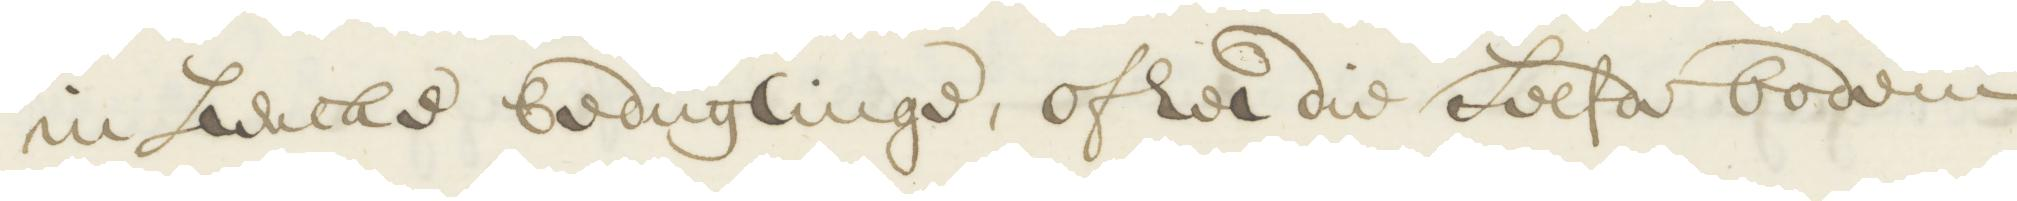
in stercke bedugtinge, of het die selfde bodem
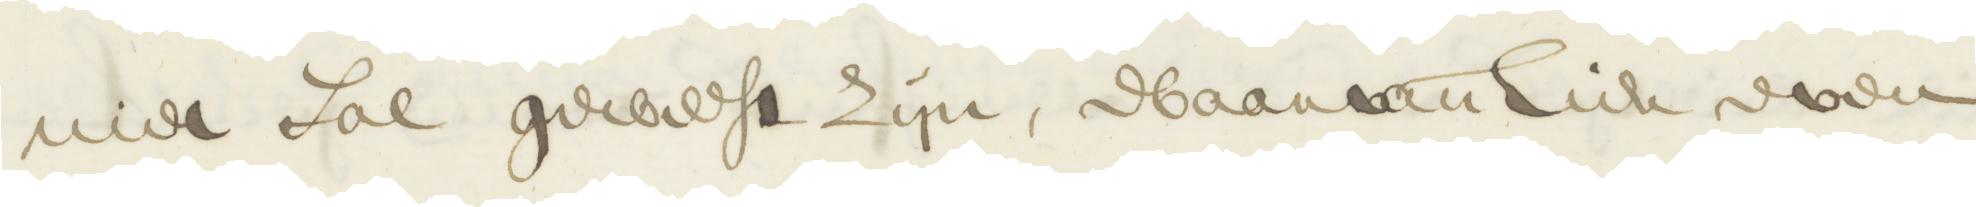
niet sal geweest zijn, waarvan hier even
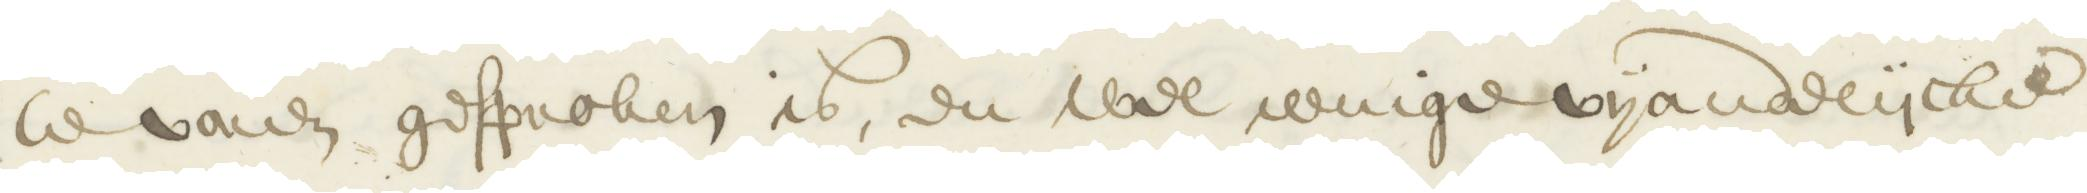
te voren gesproken is, en wel eenige vijandelijcke
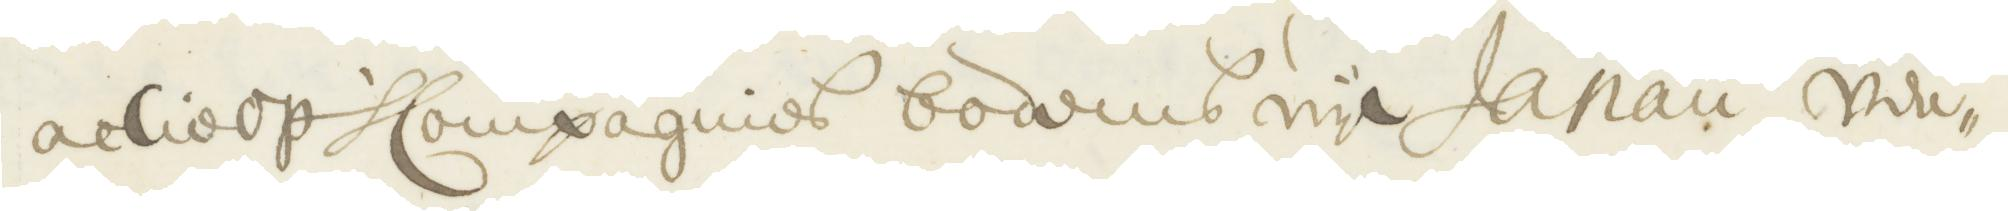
actie op 's Compagnies bodems uijt Japan ver„
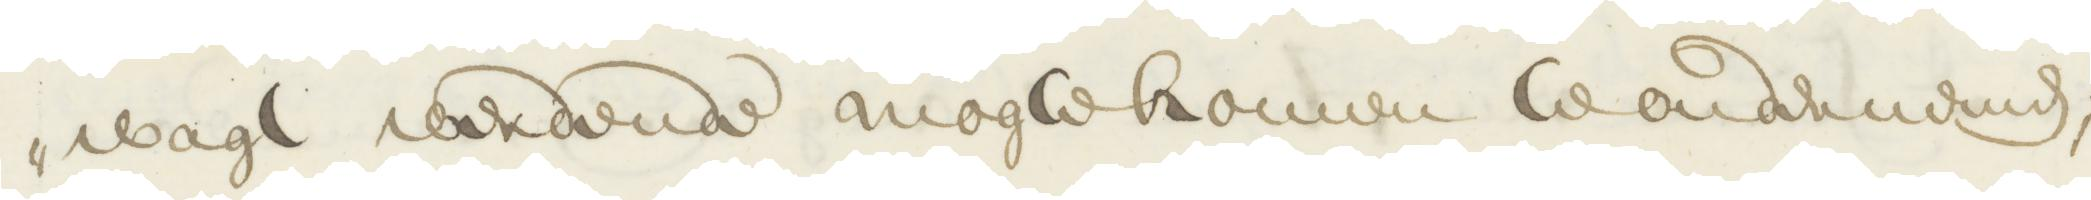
„wagt werdende mogte komen te ondernemen;
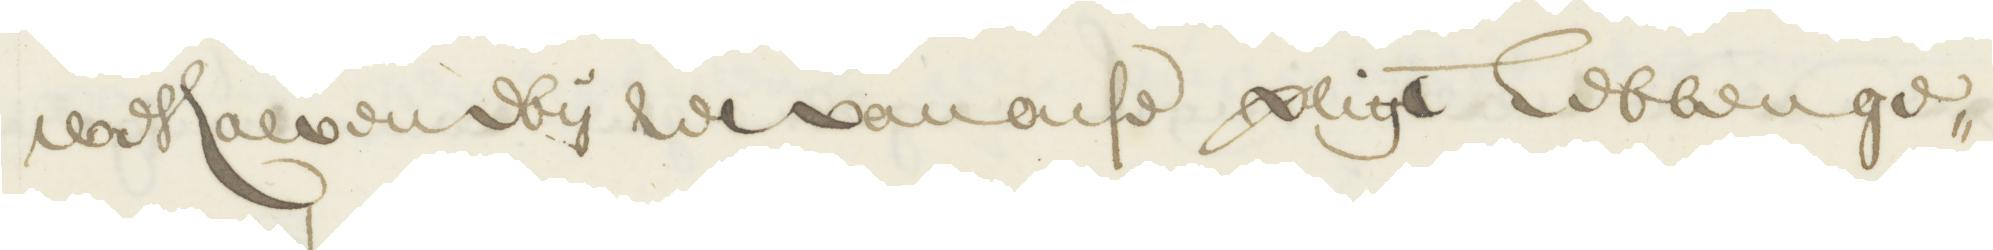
weshalven wij het van onse pligt hebben ge„
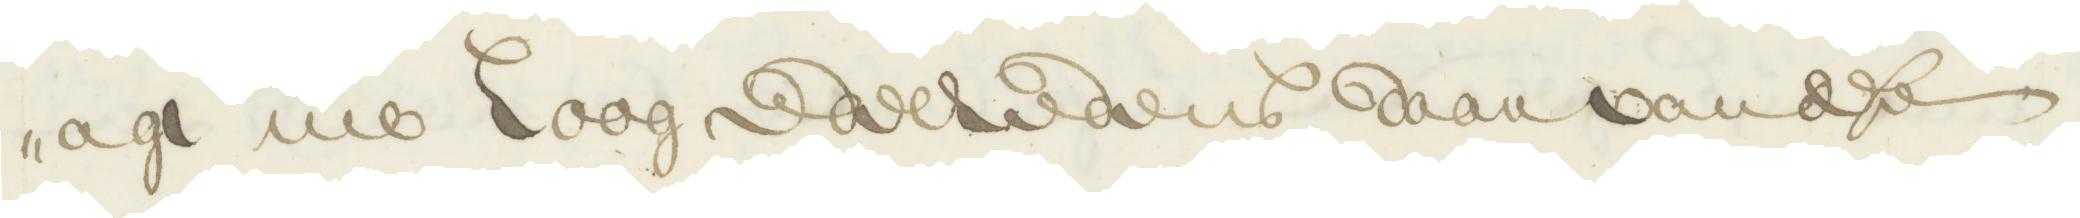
„agt uw hoog Edelhedens daar van dese
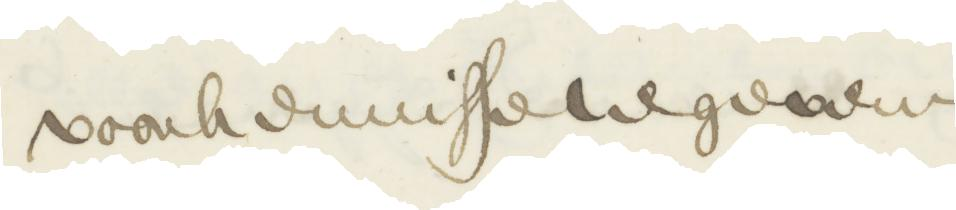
voor kennisse te geven
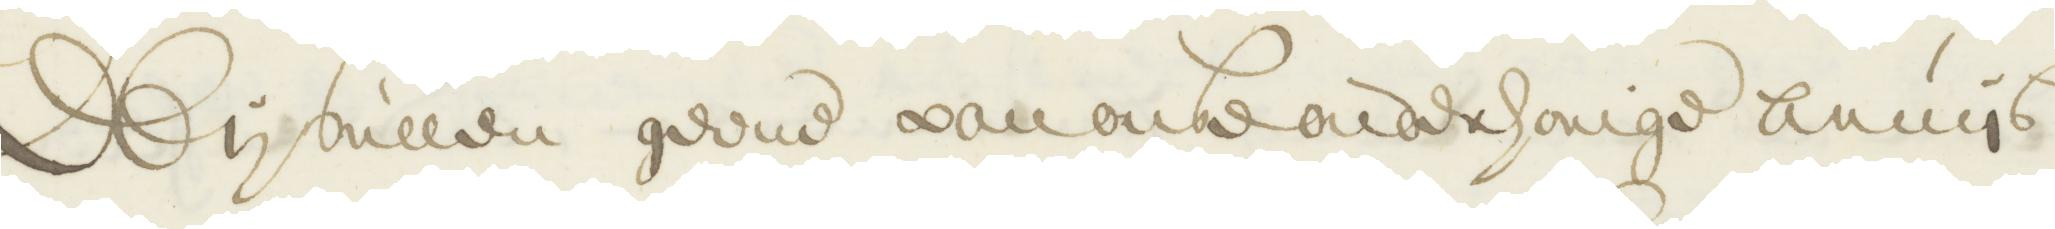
Wij sullen geene van onse onderhorige kruijs
